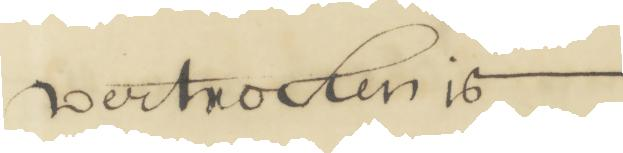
vertrocken is
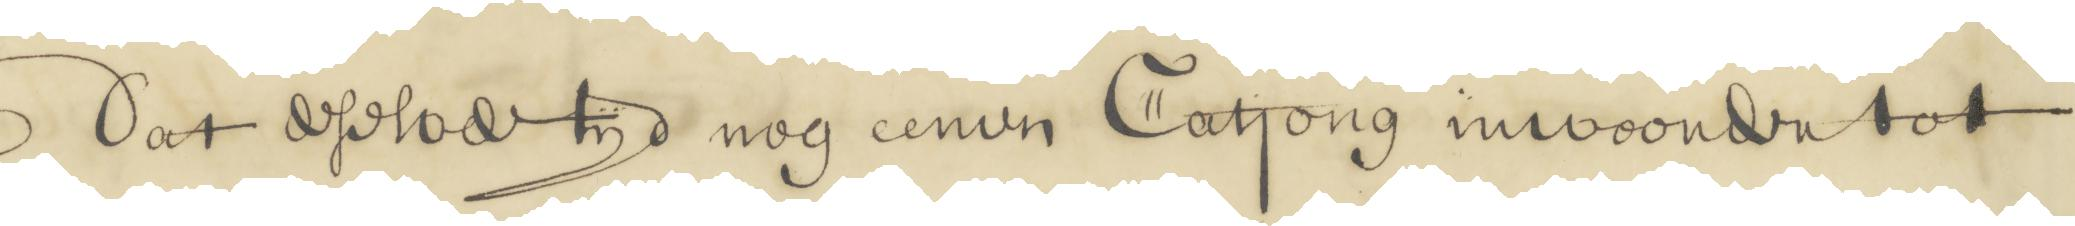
dat deselve tijd nog eenen Catjong inwoonder tot
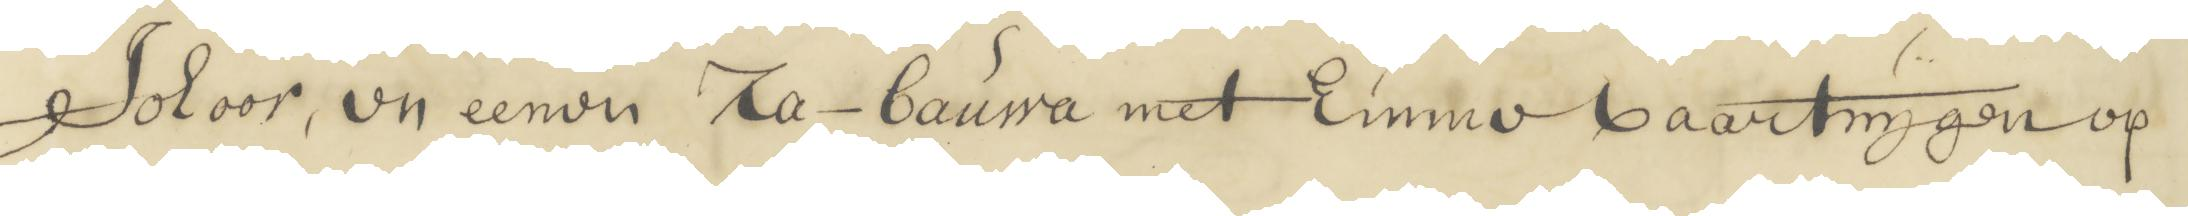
Iohoor, en eenen Za-bauwa met hunne vaartuijgen op
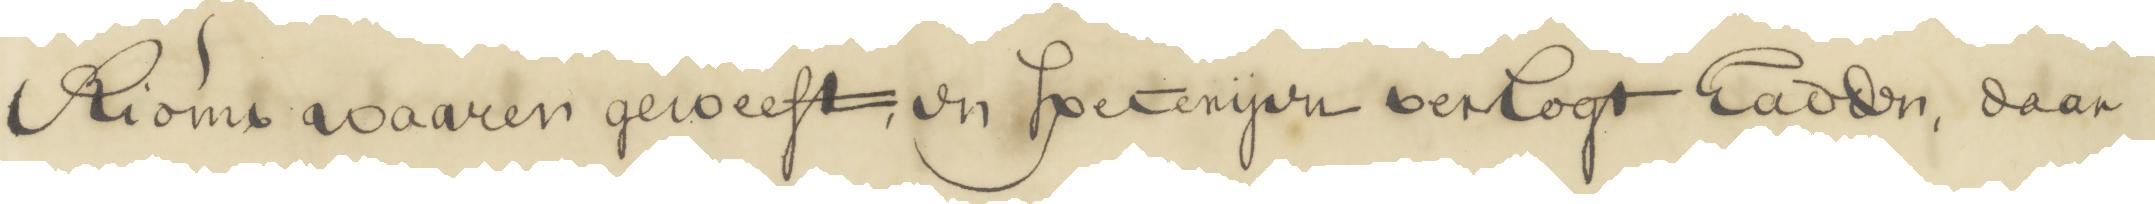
Riouw waaren geweest, en specerijen verkogt hadden, daar
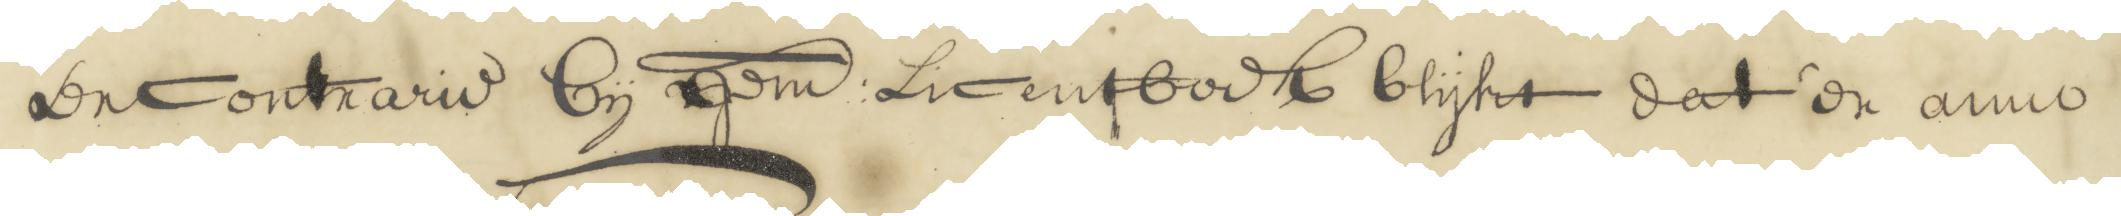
ter contrarie bij gem: licentboek blijkt dat 'er anno
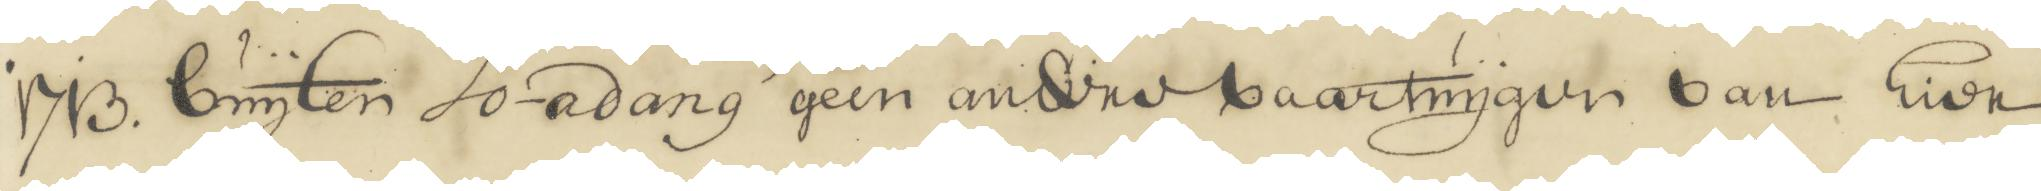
1713. buijten To-adang geen andere vaartuijgen van hier
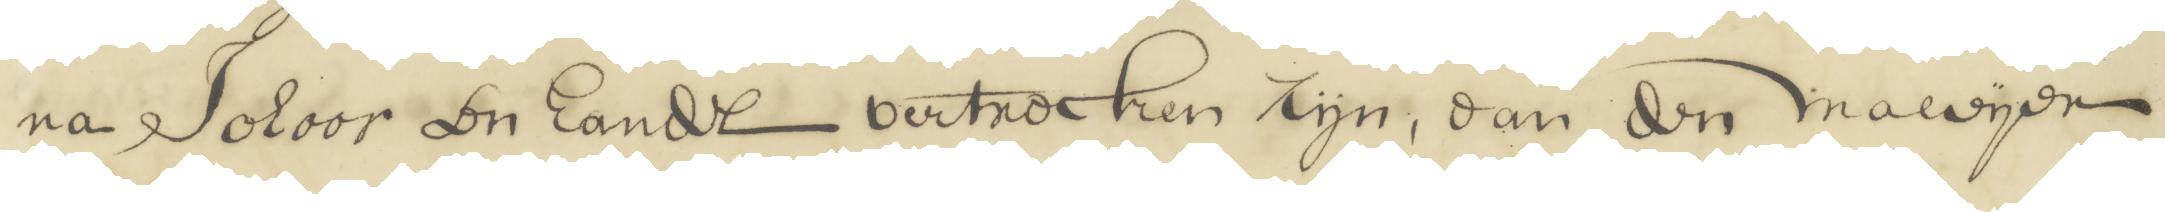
na Iohoor ten handel vertrocken zijn, dan den maleijer
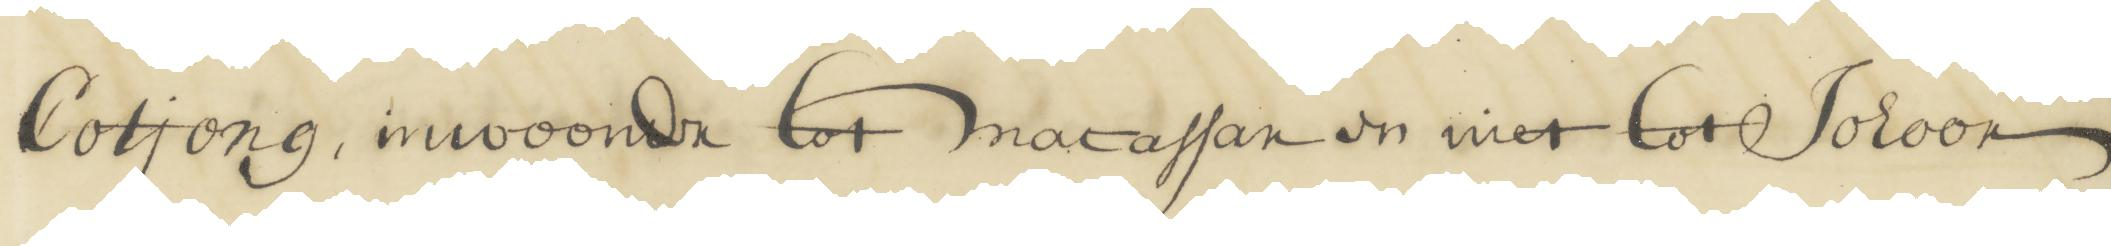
Cotjong, inwoonder tot macassar en niet tot Iohoor
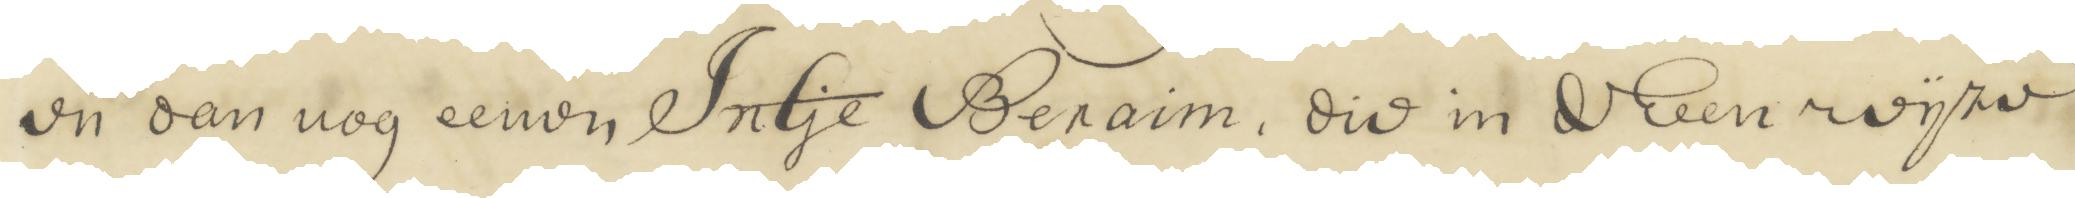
en dan nog eenen Intje Beraim, die in de heen reijze
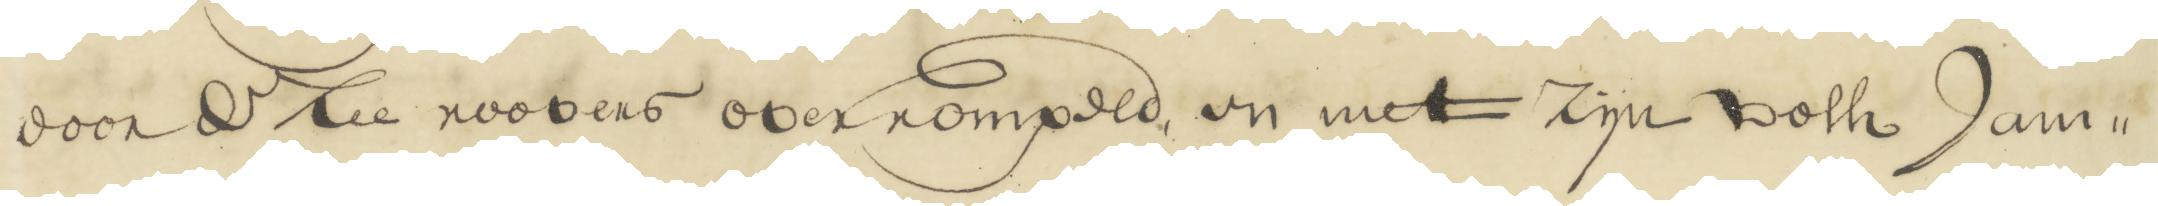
door de Zee roovers overrompeld, en met zijn volk Jam„
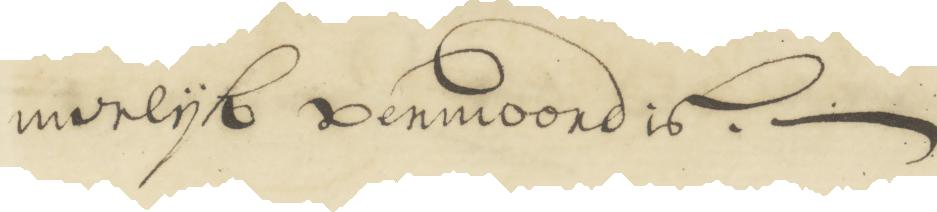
merlijk vermoord is.—
